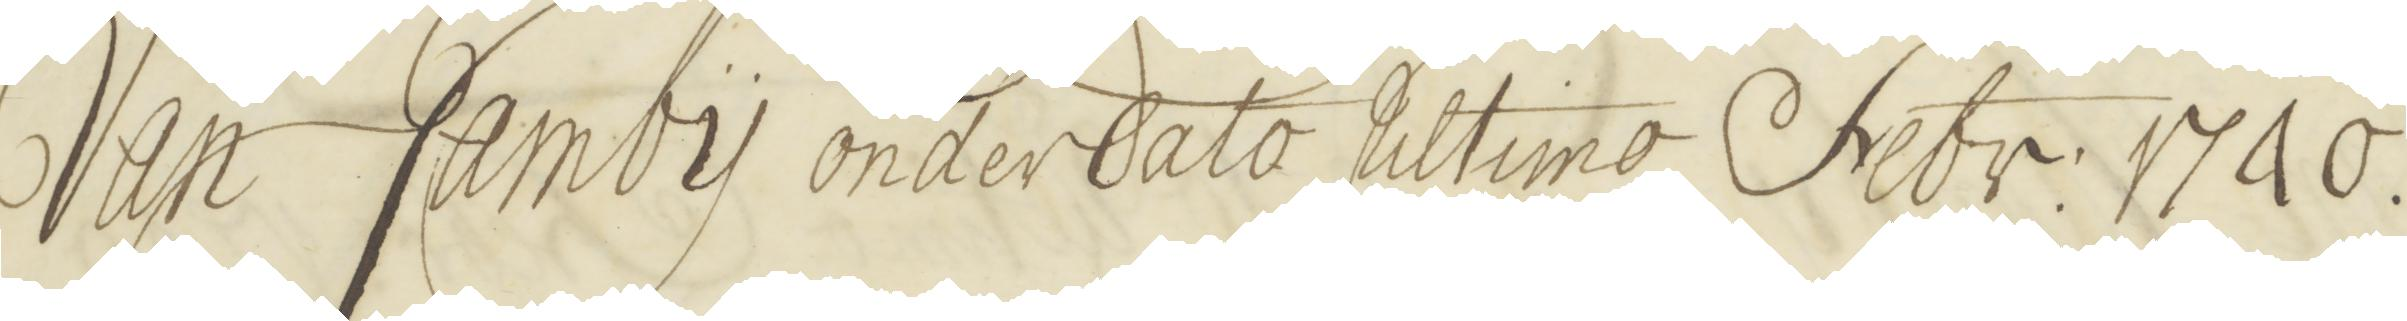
Van Jambij onder dato Cultimo Febr: 1740.
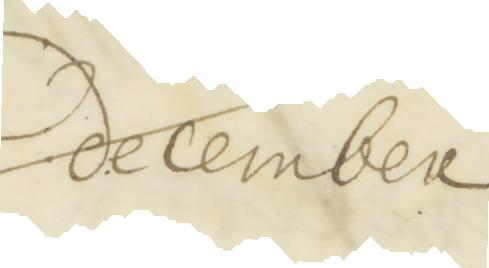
december
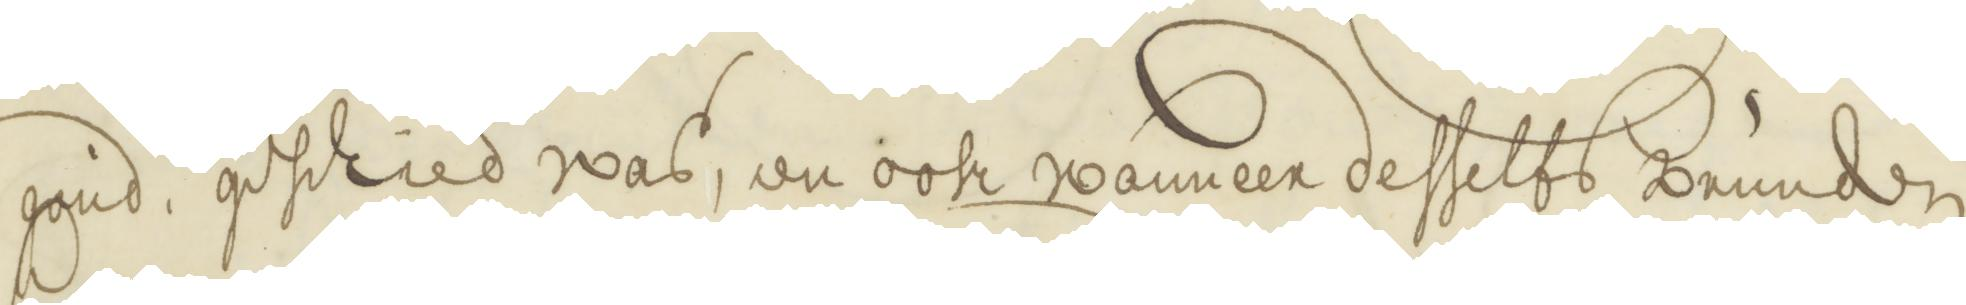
goud, geschied was, en ook wanneer desselfs vrunden
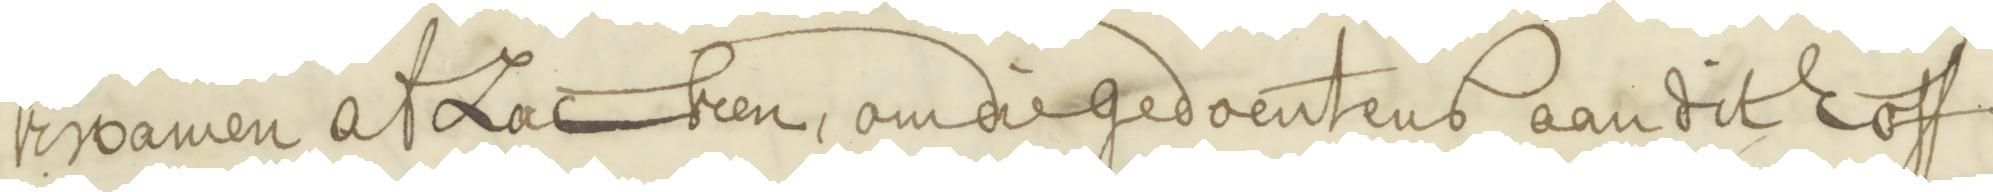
kwamen afzacken, om die gedoentens aan dit hoff
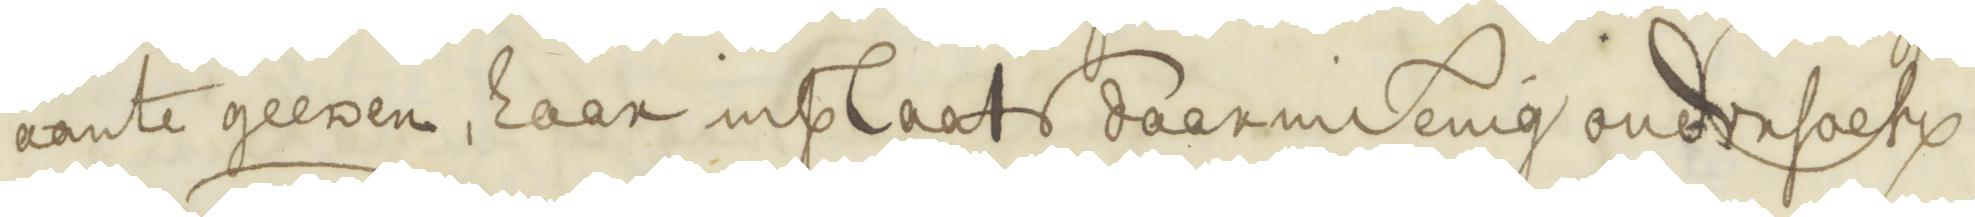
aante geeven, haar inplaats daar in Eenig ondersoek
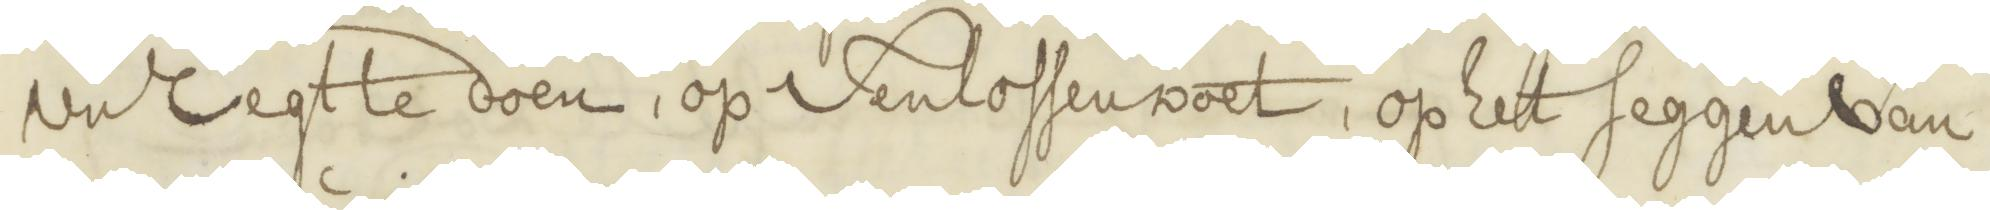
terregtte doen, op Een lossen voet, op het seggen van
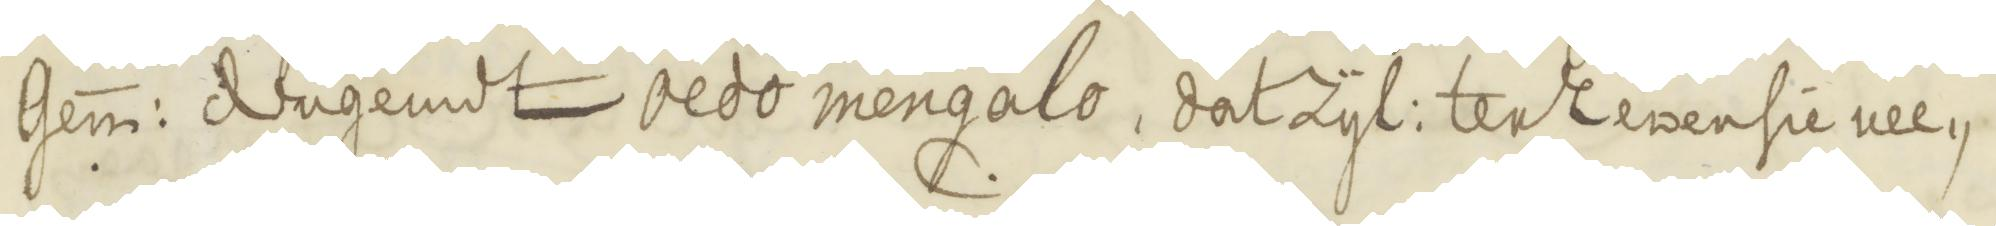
gem: deugeniet oedo mengalo, dat zijl: ter revensie nee„
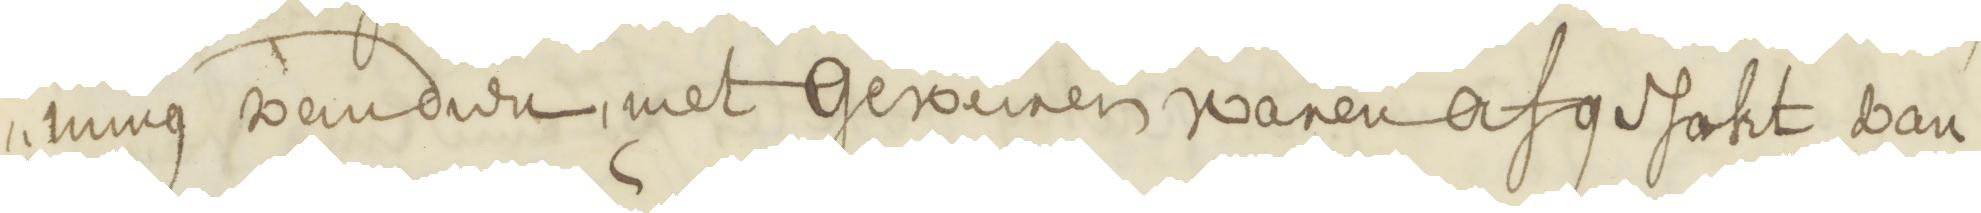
ming van dien, met geweiren waren afgesakt van
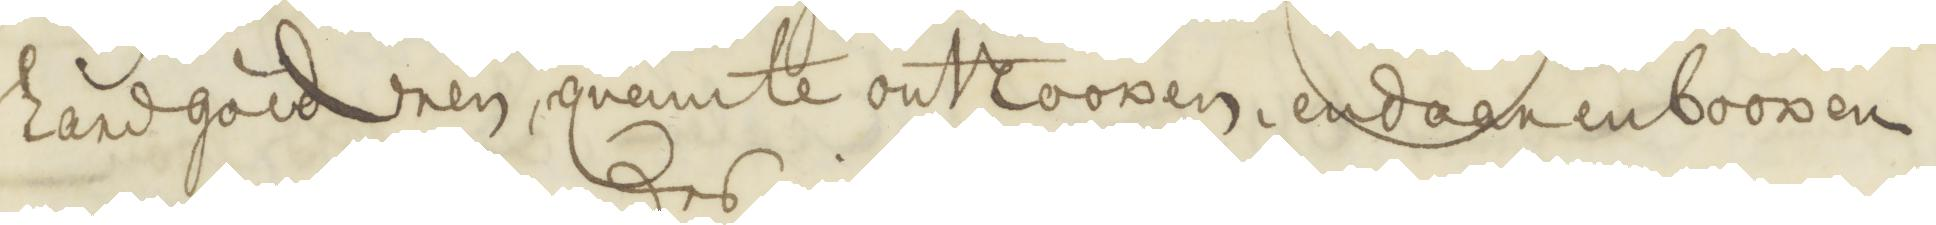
hare goederen, quamte ontcooven en daar en booven
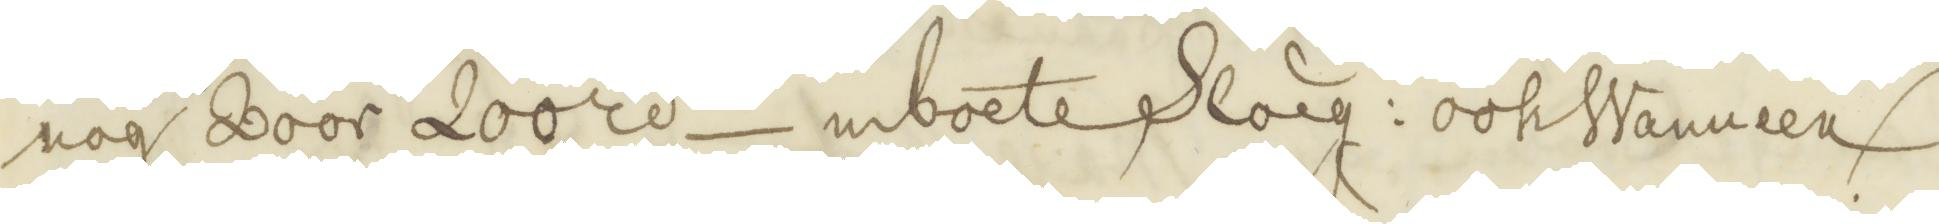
nog door voor voord-rs inboete Sloeg: ook Wanneer
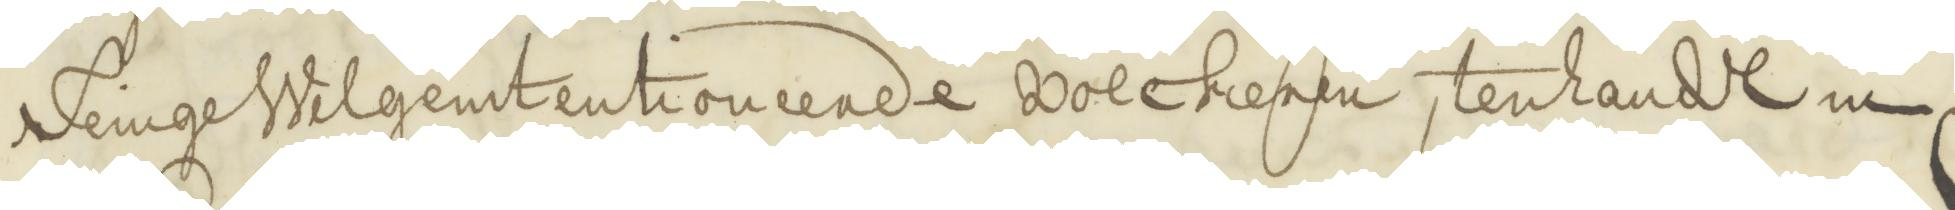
Eenige Welgeintentioneerde volckeren, ten handel in
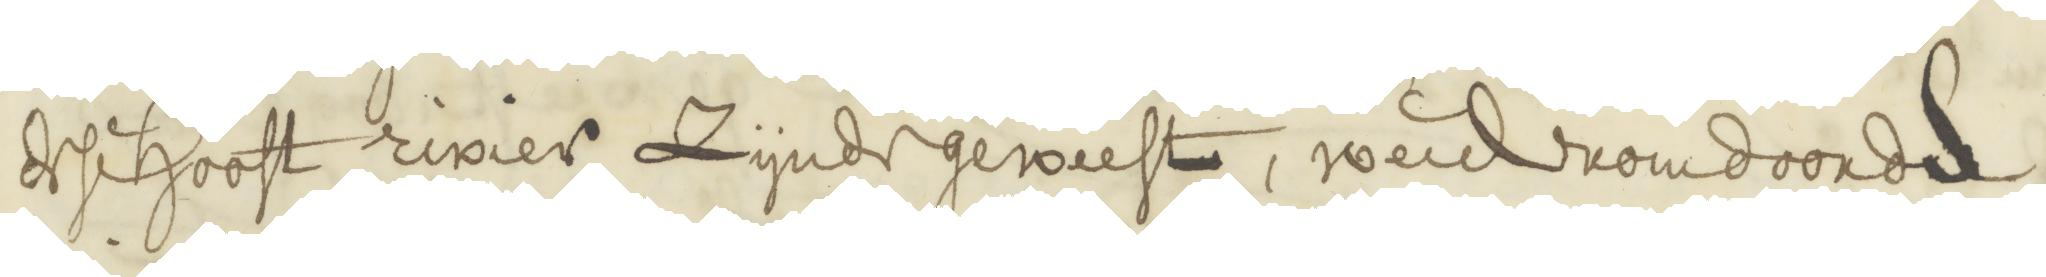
dese hooft rivier zijnde geweest, weerderom doorde
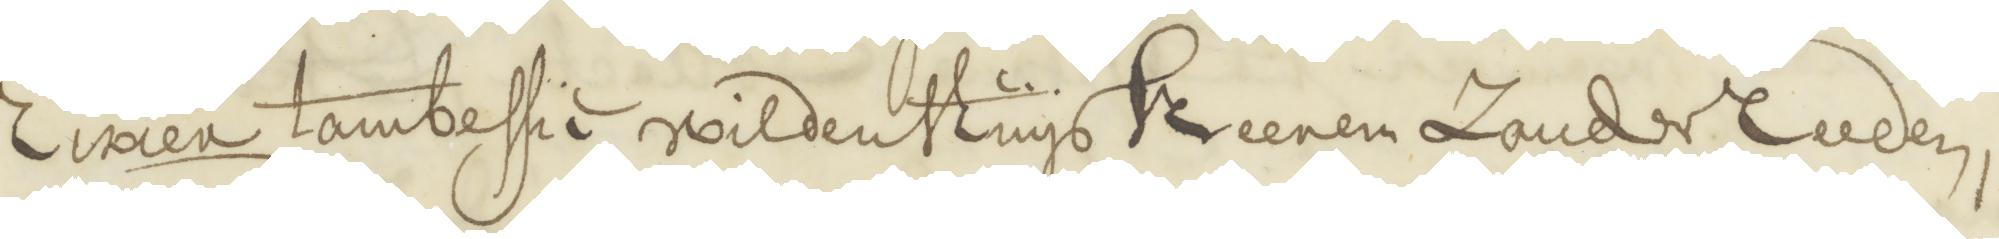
rivier tambessie wilden thuijs keeren zonder reeden,
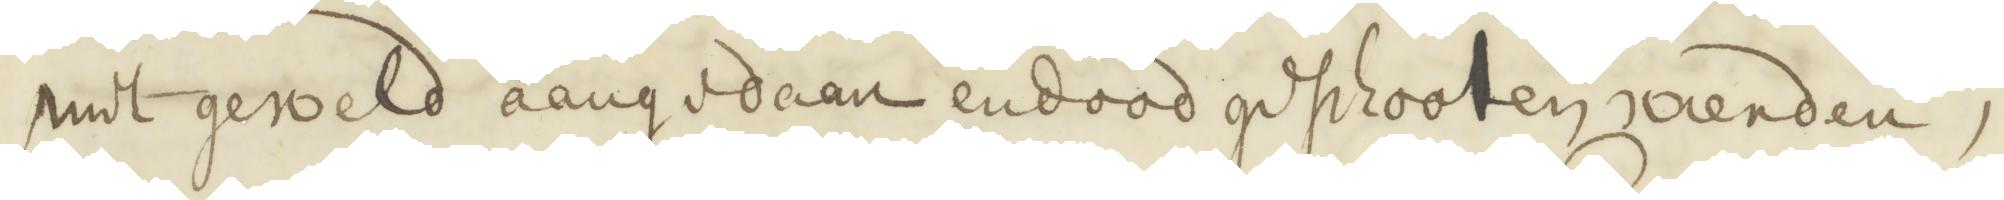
met geweld aangedaan en dood geschooten wierden,
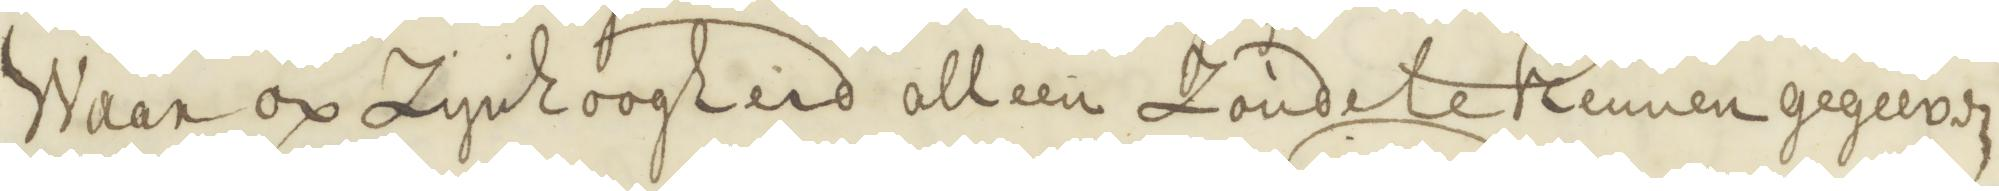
waar op zijn hoogheid alleen zoude te kennen gegeeven
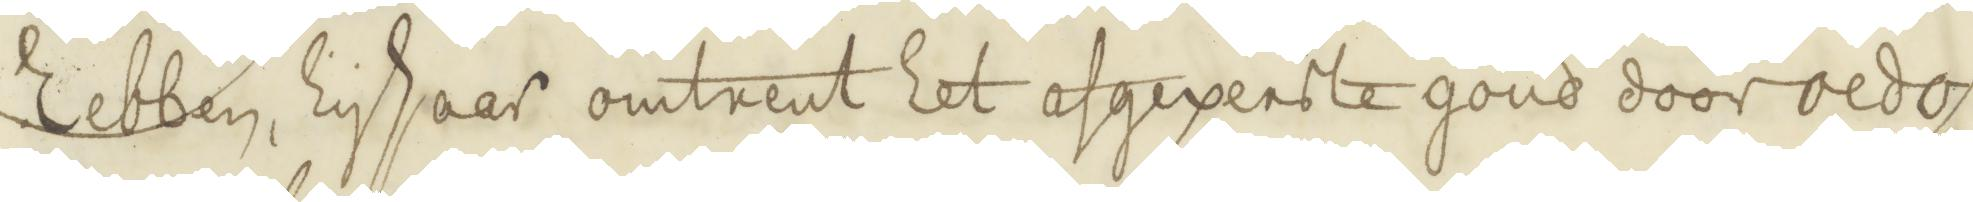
hebben, hij haar omtrent het afgeperste goud door oedo
